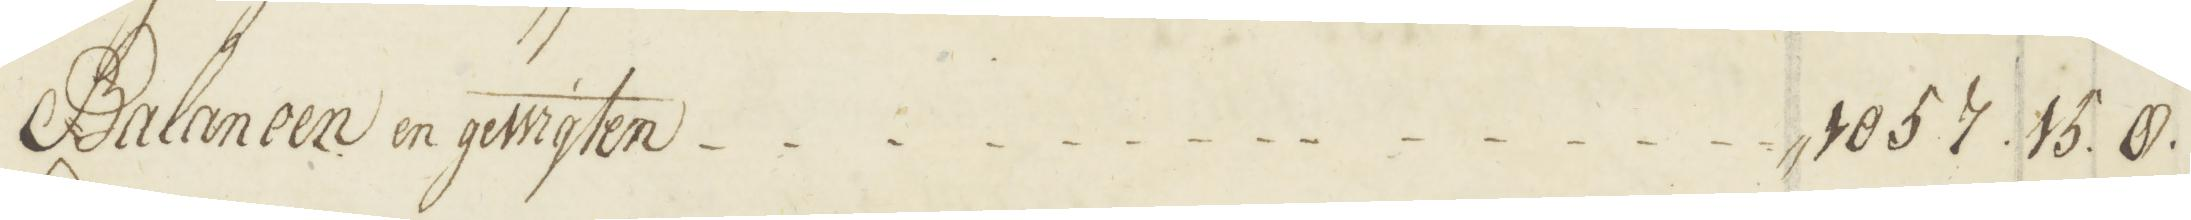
Balancen en gewigten _ _ _ _ _ _ _ _ _ _ _ _ _ _ =„ 7057. 15. 8.
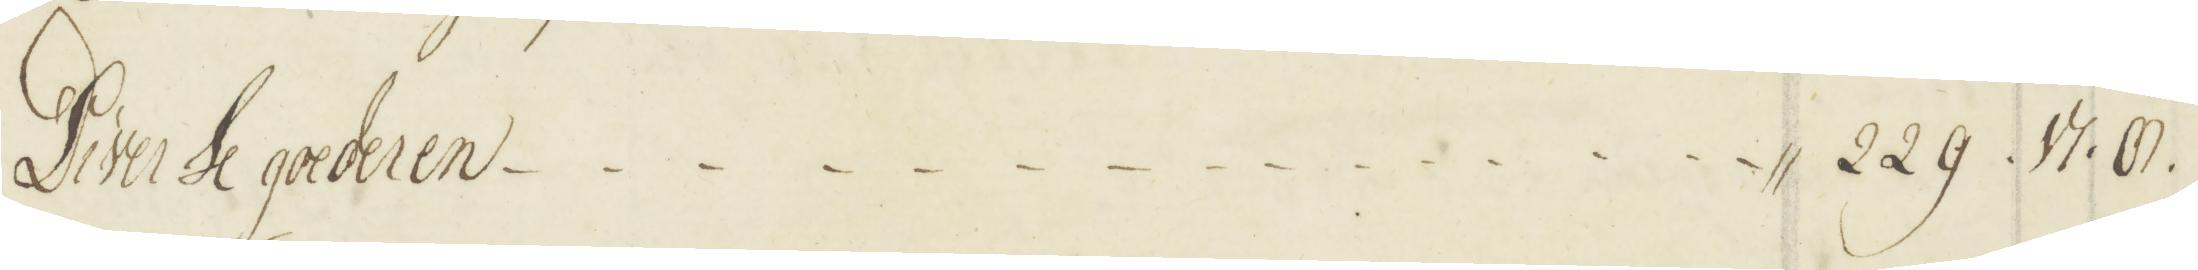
Diverse goederen _ _ _ _ _ _ _ _ _ _ _ _ _ _ _„ 229. 17. 8.
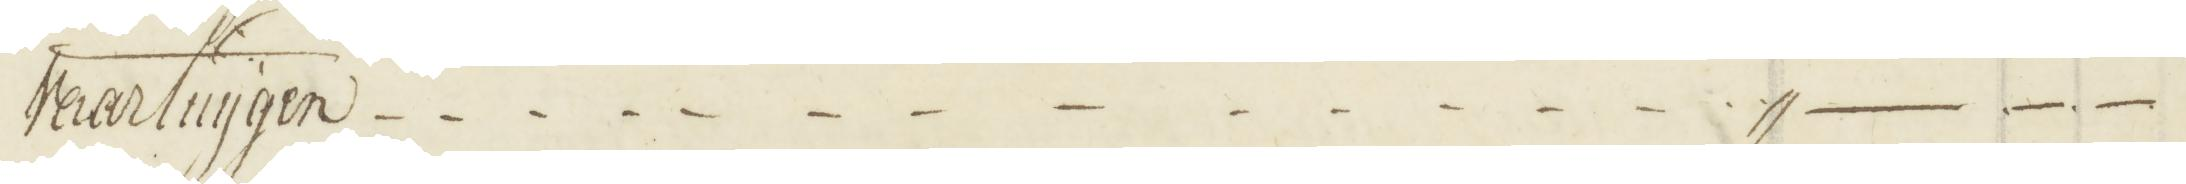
vaartuijgen _ _ _ _ _ _ _ _ _ _ _ _ _. .„ —. —. —
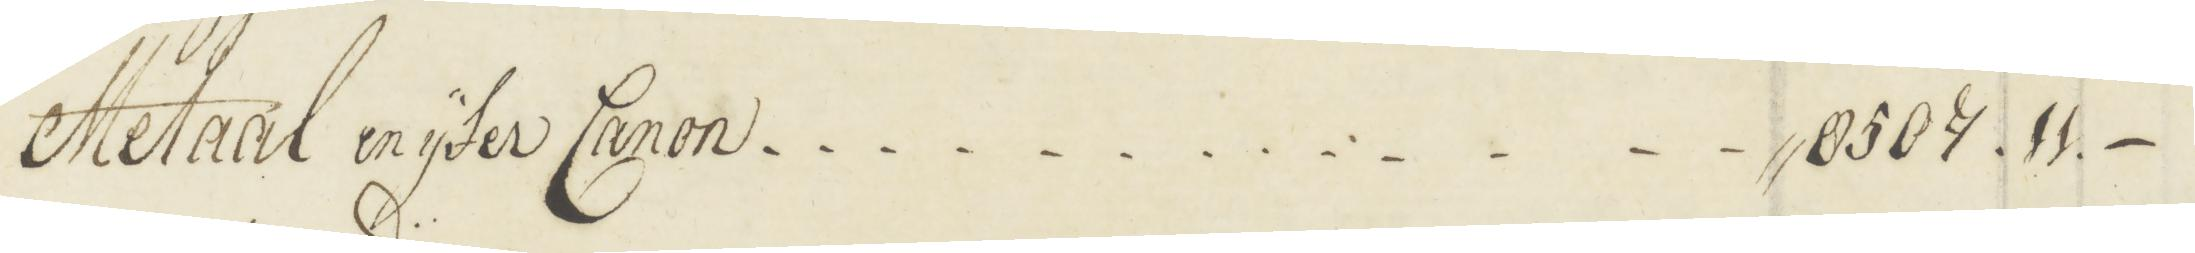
Metaal en ijser Canon _ _ _ _ _ . . . _. _ _ _ _„ 8507. 11. —
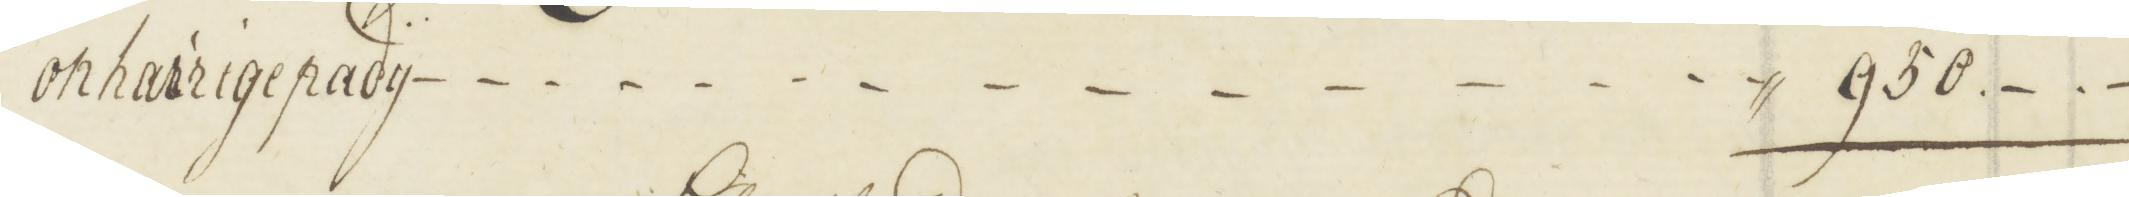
onhaarige padij- _ _ _ _ _ _ _ _ _ _ _ _ _ _„ 950. —. —
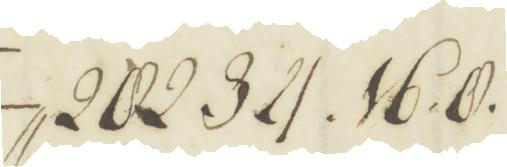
„28234 . 16.8.
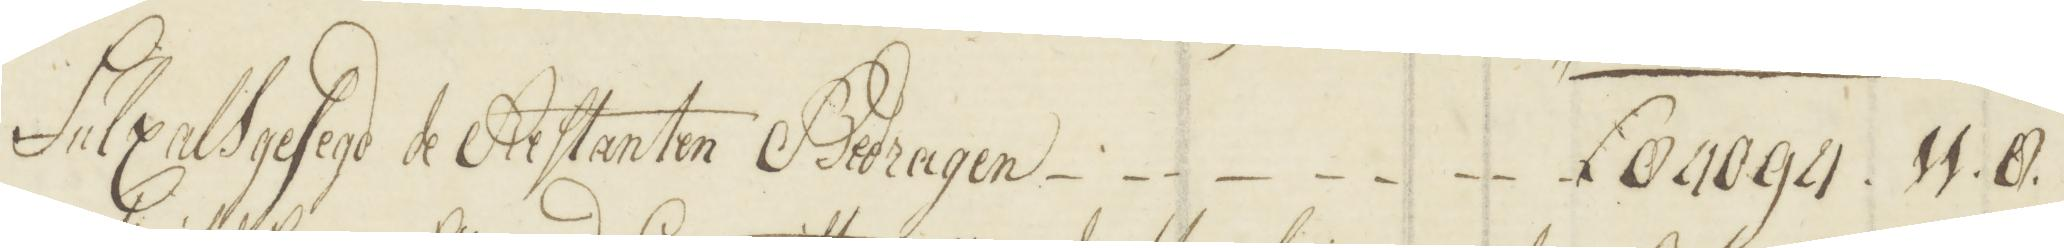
Sulx als gesegd de Restanten Bedragen_ _ _ _ _ _ _ _ _ƒ84094. 11. 8.
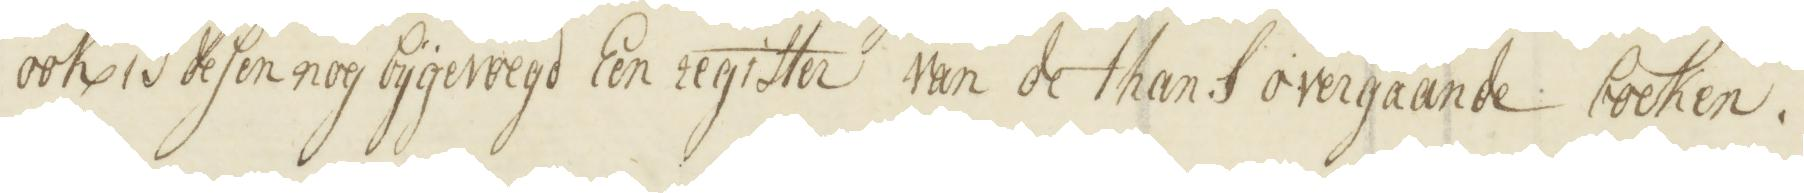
ook is desen nog bijgevoegd Een register van de thans overgaande boeken.
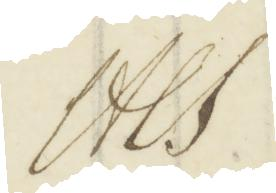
Als
